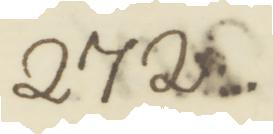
272
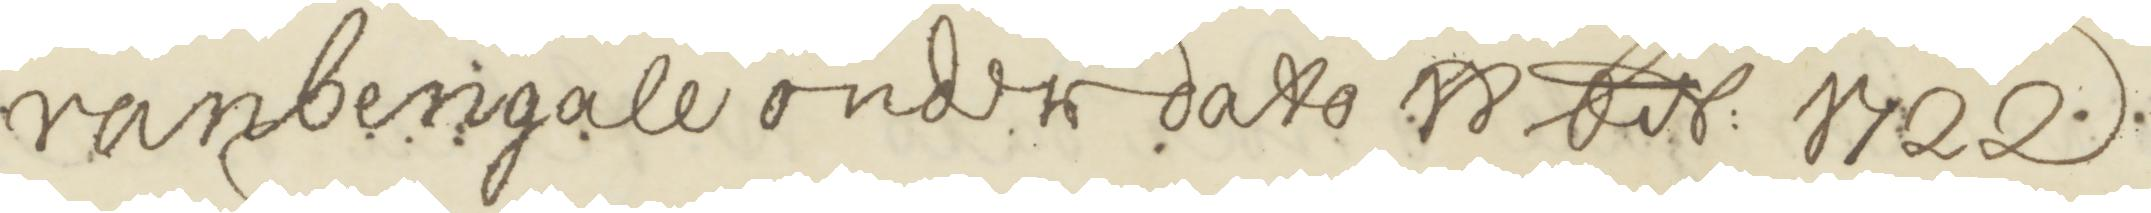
van bengale onder dato 18 feb: 1722
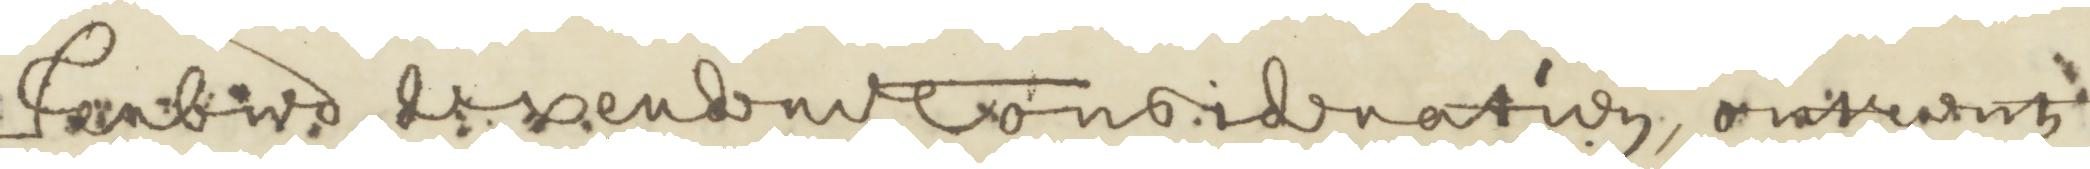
Eerbied de verdere Consideratien, ontrent
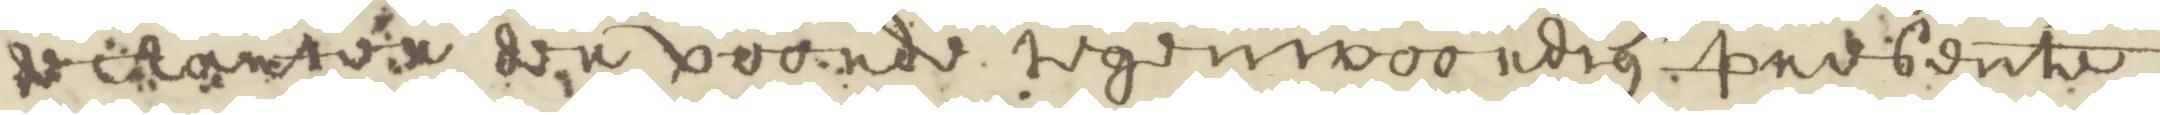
de ctarter der voor de tegenwoordig presente
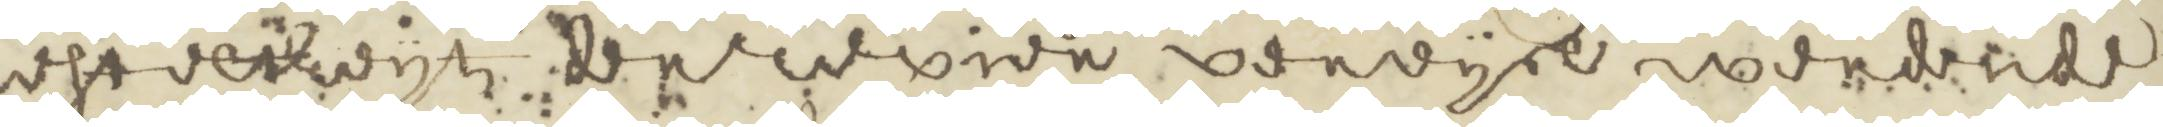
gesteltheijt der revier vereijst werdende
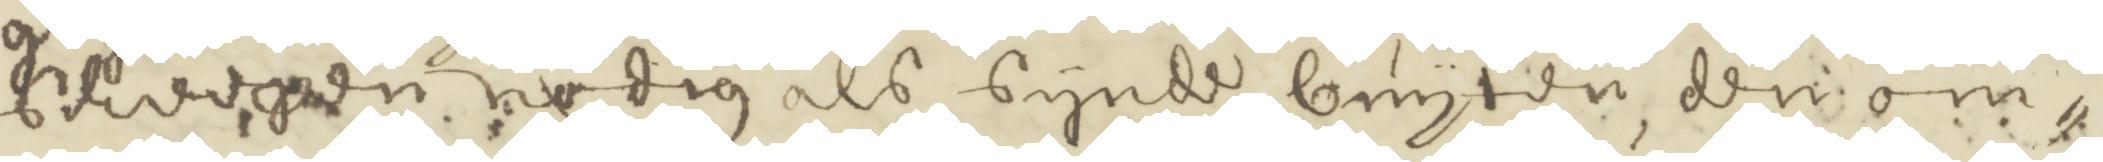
scheepen nodig als sijnde buijten den om„
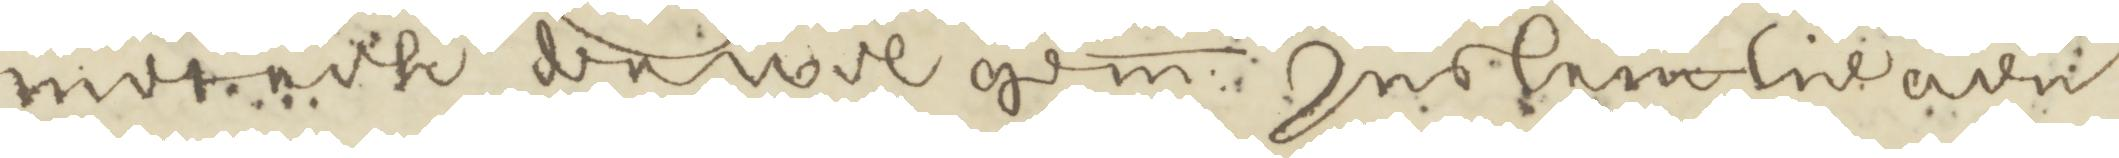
metrek der wel gem: Jnstructie aen
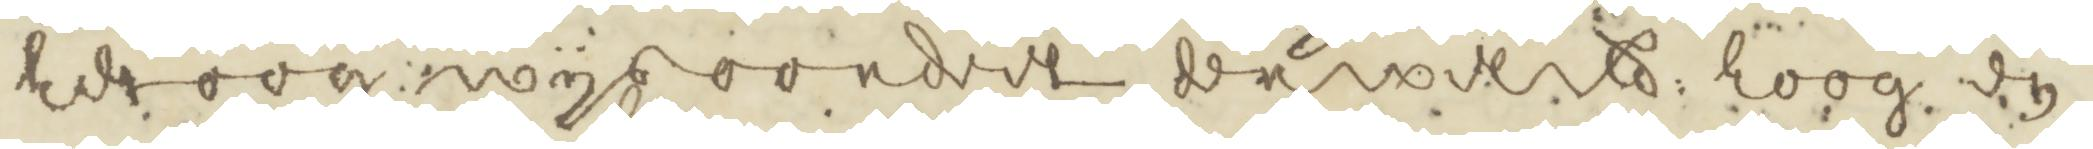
het oog wijs oordeel der wel Ed: hoog en
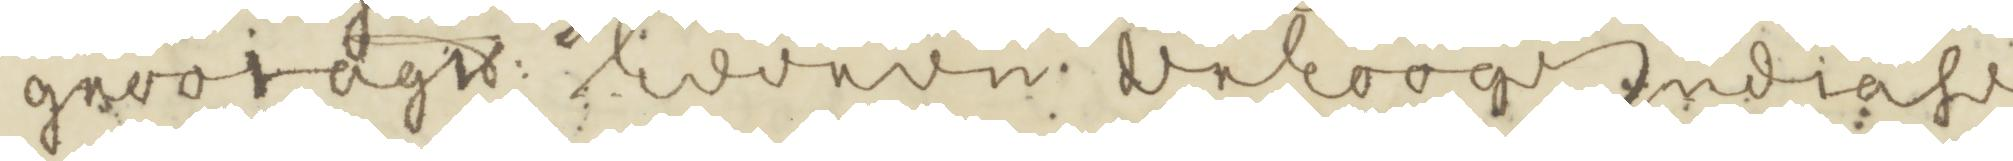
groot agtb: heeren der hooge Jndiase
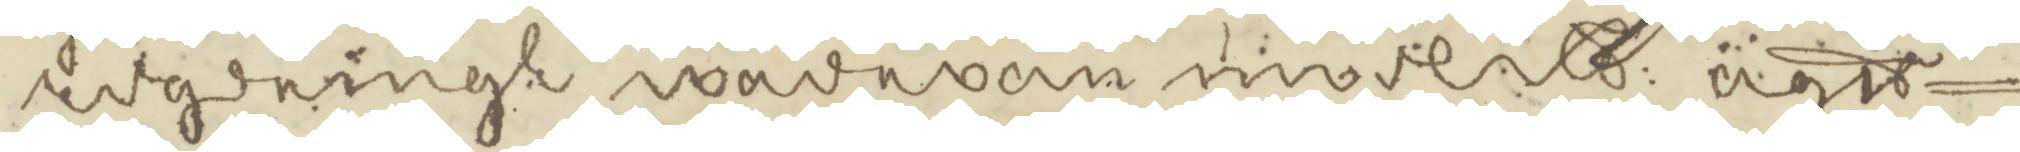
regeringh waer van uwelEd: agtb=e
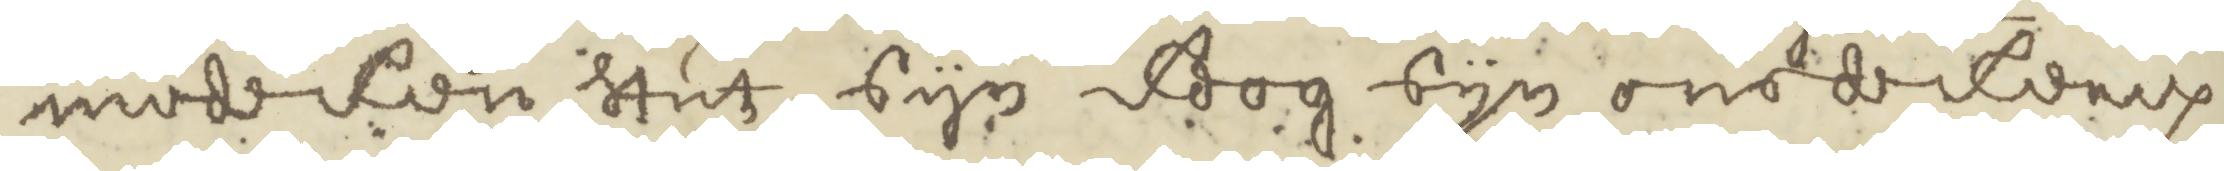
mede Een stut sijn Edog sijn ons de Eenen
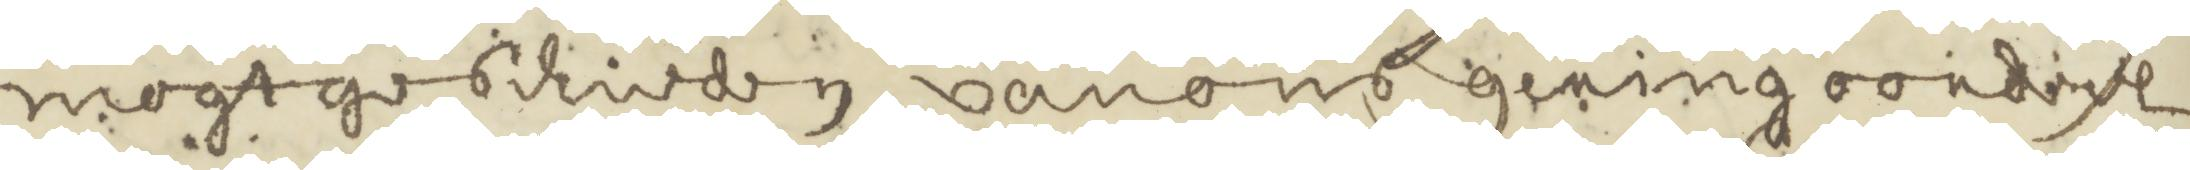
mogt geschieden van ons gering oordeel
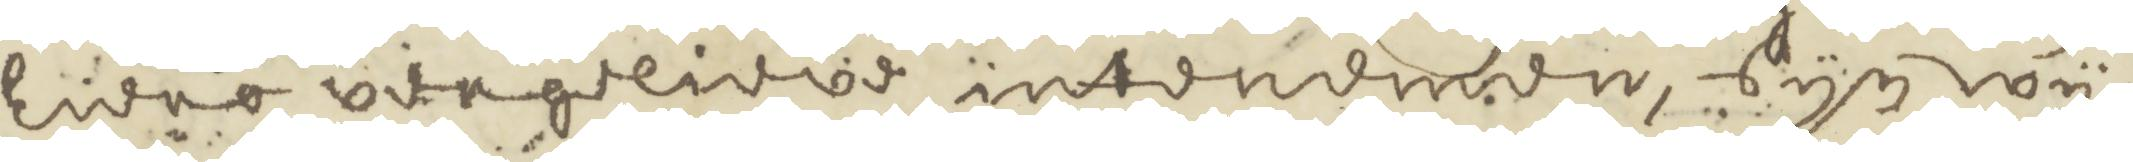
hiero vergelieve intenemen, sijn wij
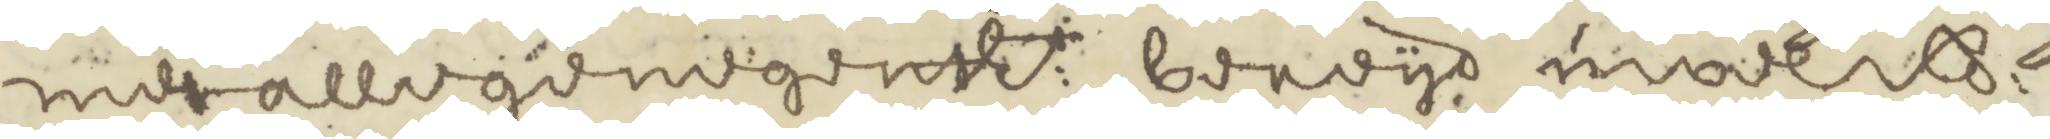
met alle genegenth:t bereijd uwelEd:
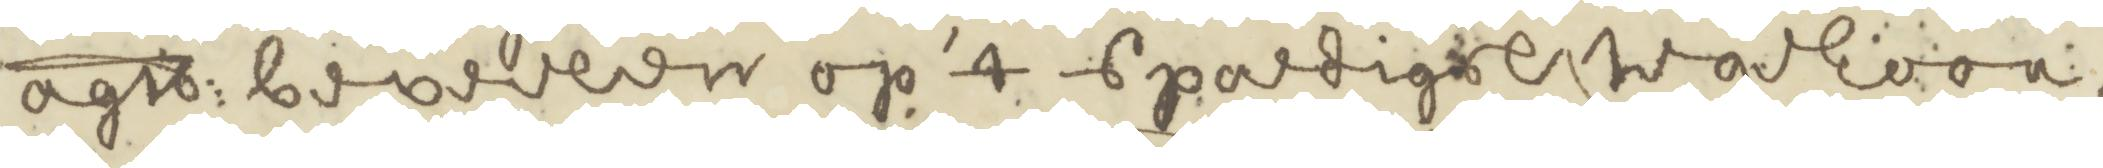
agtb: beveelen op ’t spoedigst te gehoor
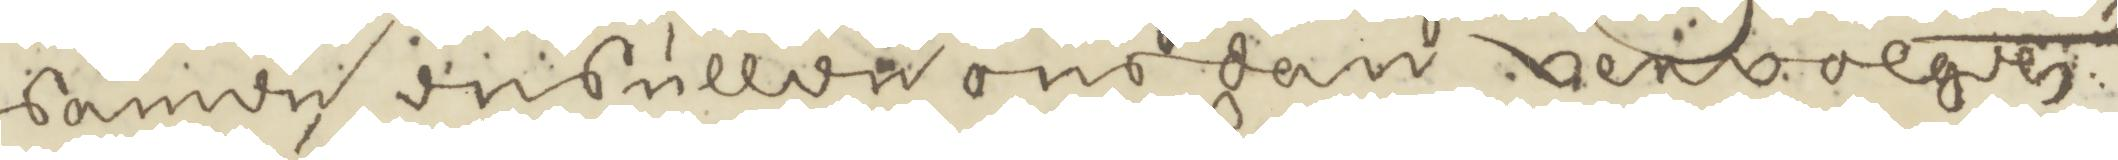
samen, en sullen ons dan vervolgelijk
